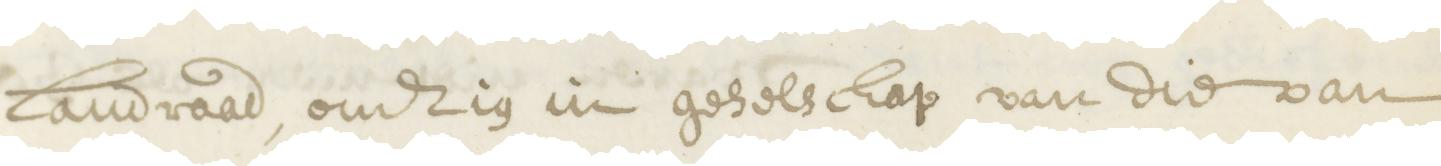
landraad, omzig in geselschap van die van
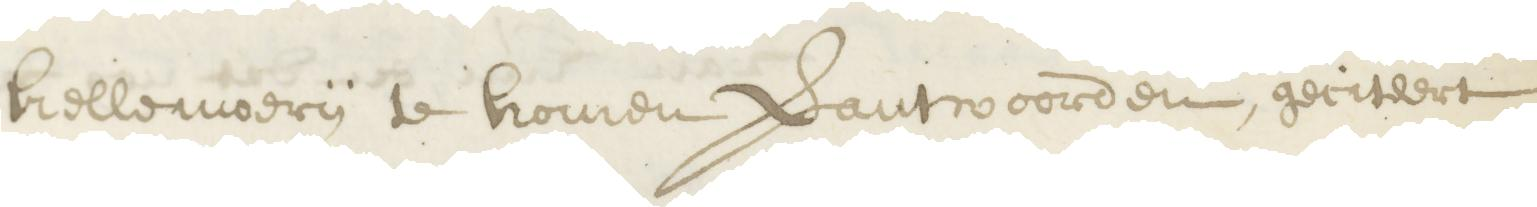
kellemoerij te komen verantwoorden, geciteert
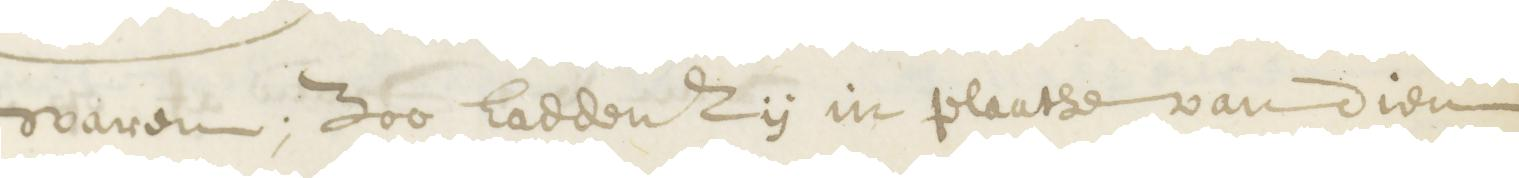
waren; Zoo hadden zij in plaatse van dien
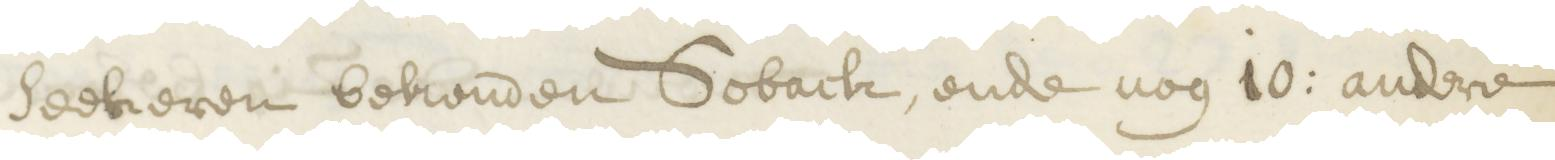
seekeren bekenden doback, ende nog 10: andere
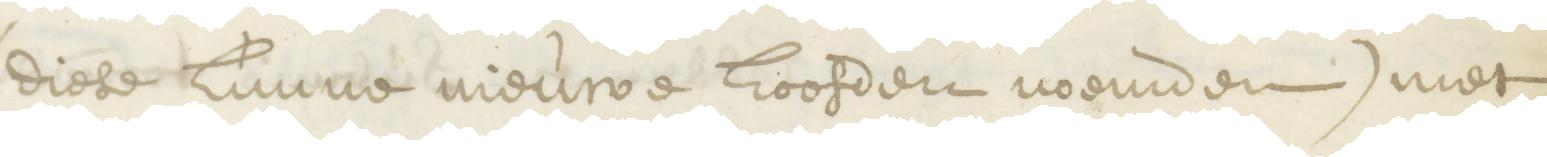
(diese hunne nieuwe hoofden noemden) met
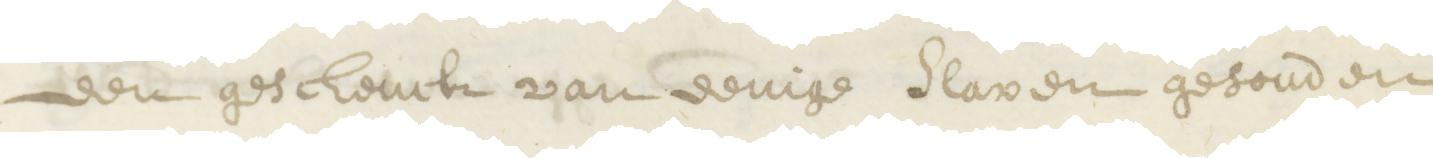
een geschenck van eenige slaven gesonden
